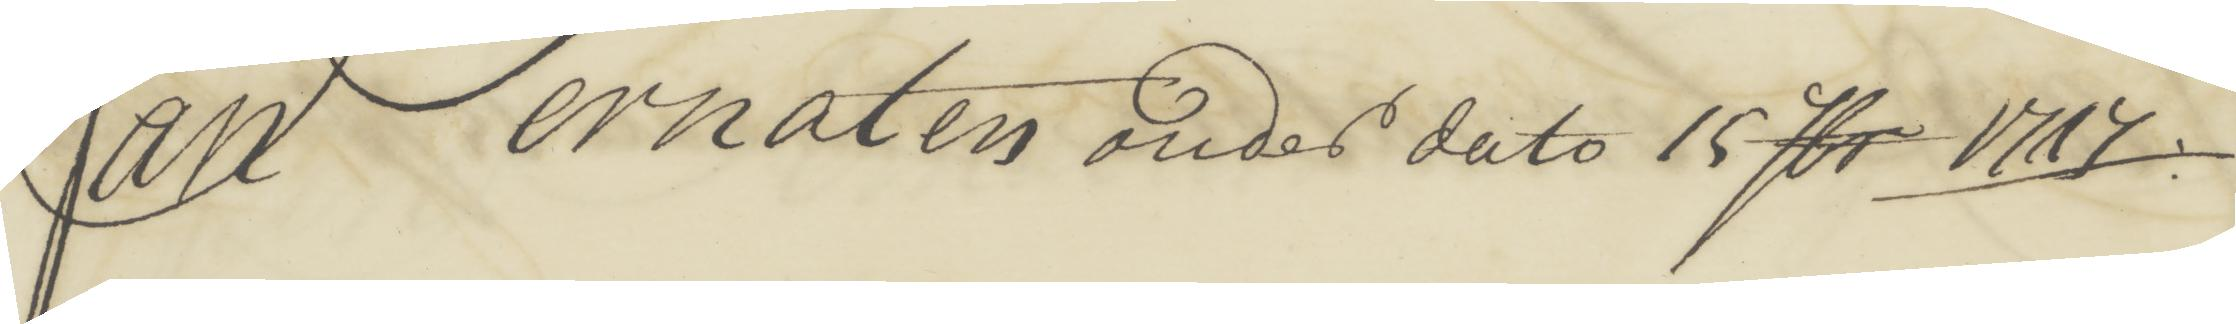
Van Ternaten onder dato 15 7br 1747:
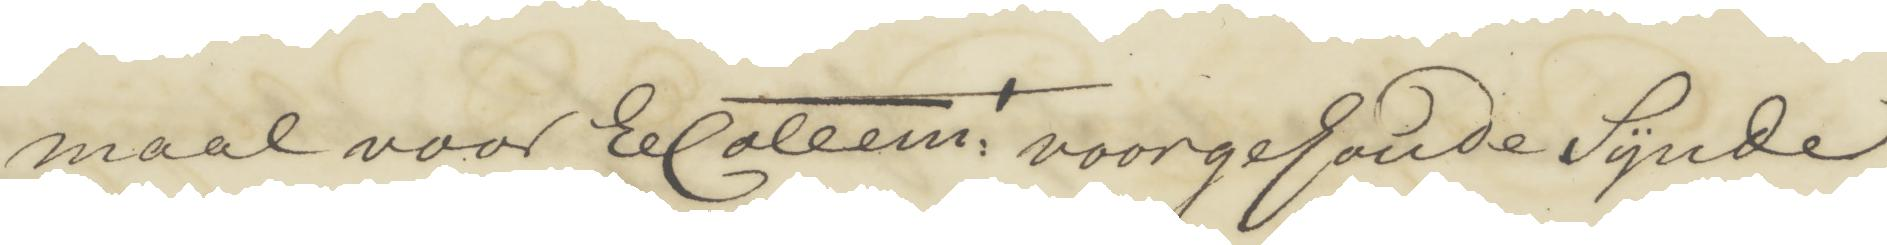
maal voor recollem:t voorgehoude sijnde
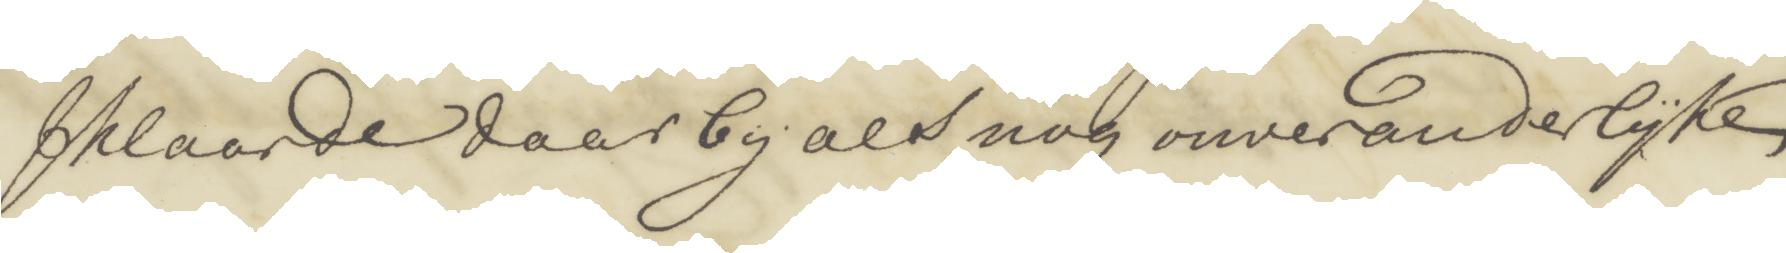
verklaarde daar bij als nog onveranderlijke
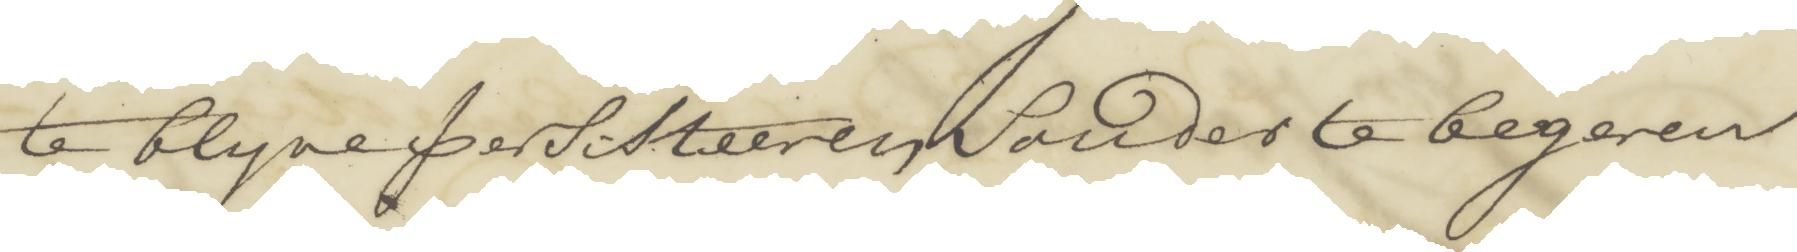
te blyve persisteeren sonder te begeren
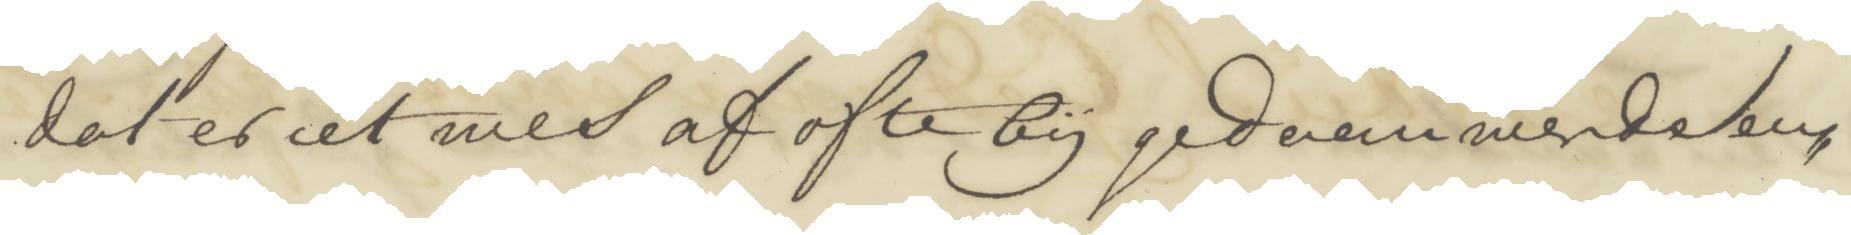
dat es ietwes af ofte bij gedaan werde en„
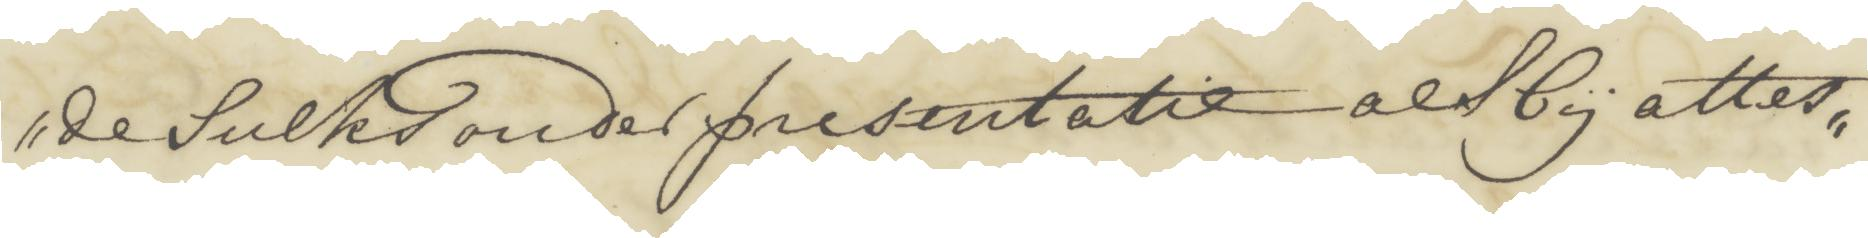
„de sulks onder presentatie als bij attes„
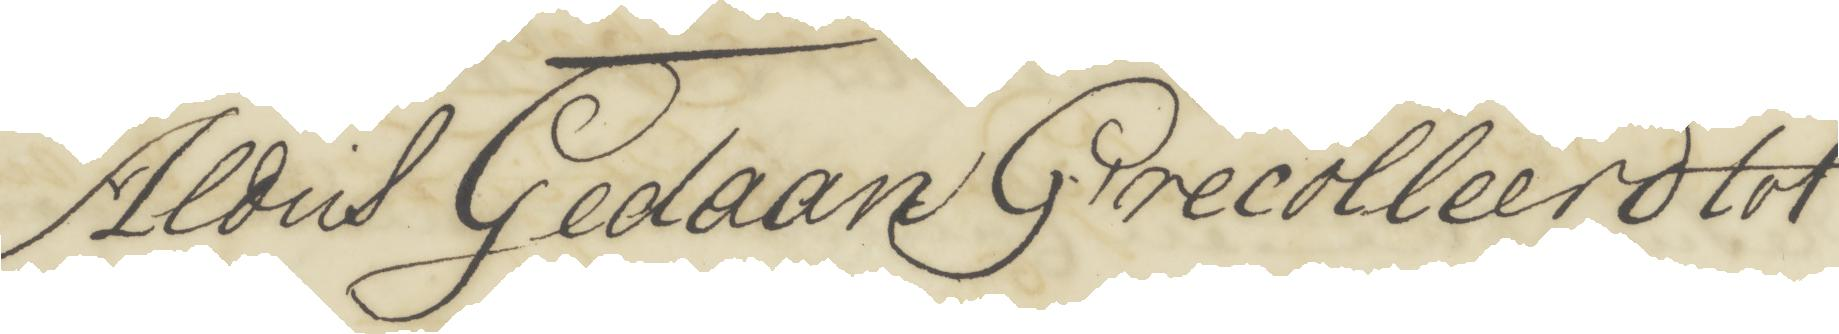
Aldus Gedaan G'recolleerd tot
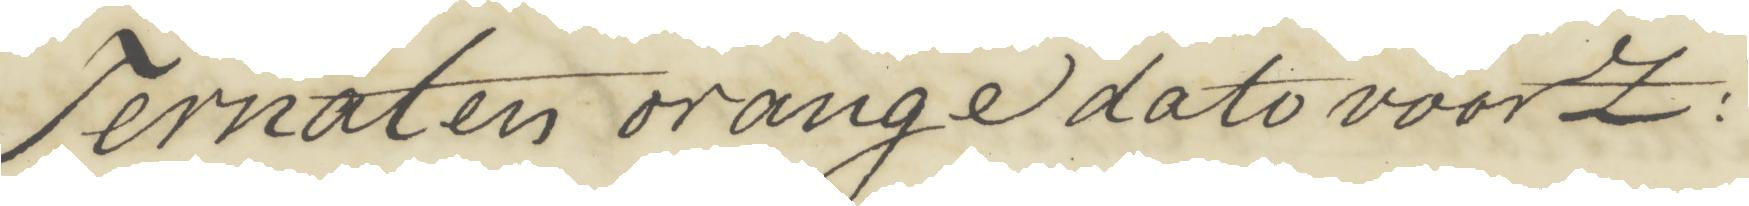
Ternaten orange dato voorz:
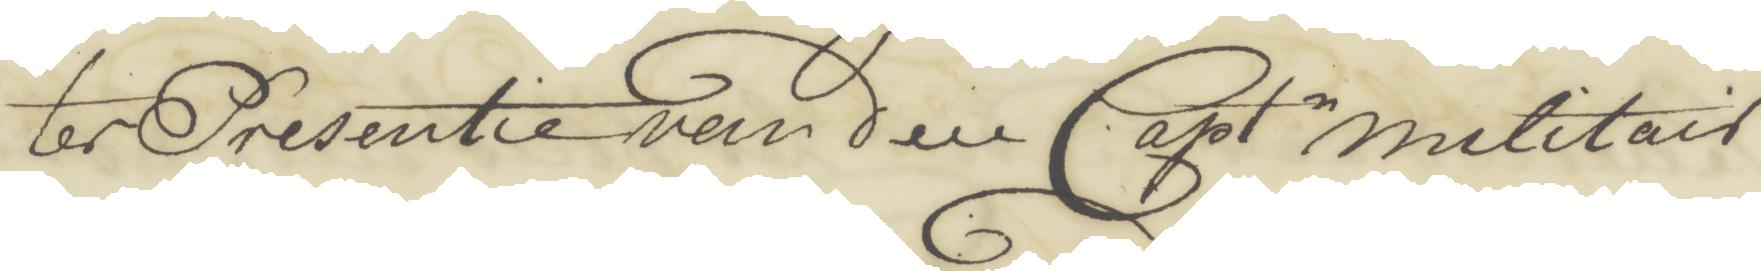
ter Presentie van den Captn militair
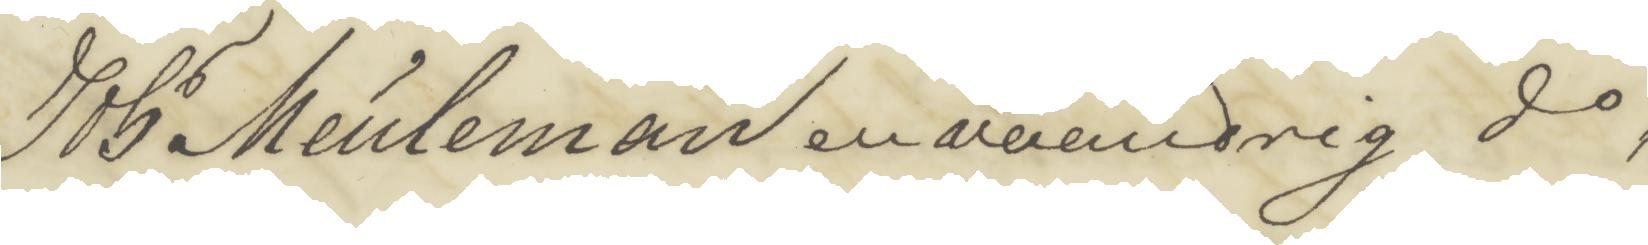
Johs Meuleman en vaandrig do
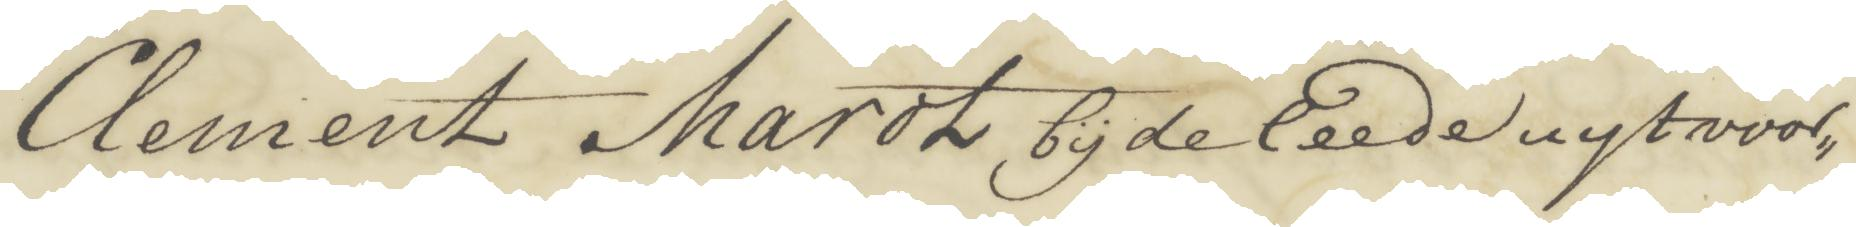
Clement Marot bij de leede uyt voor„
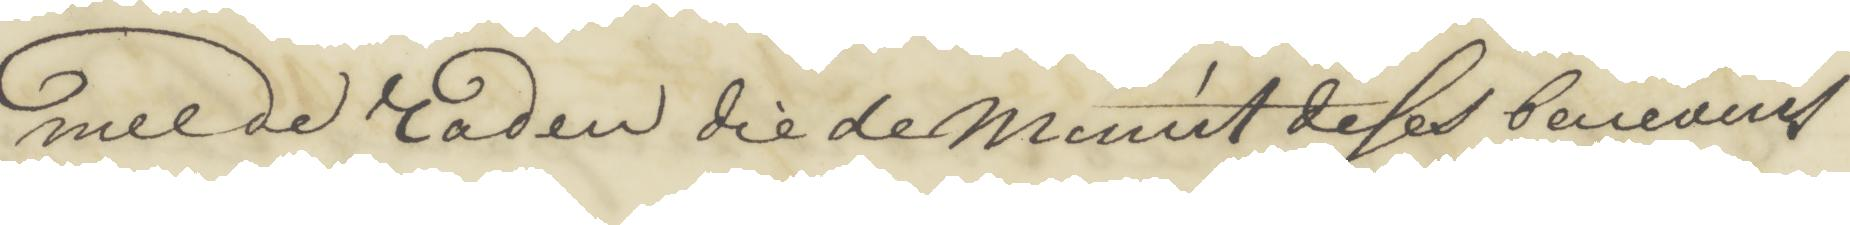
melde raden die de minut deses benevens
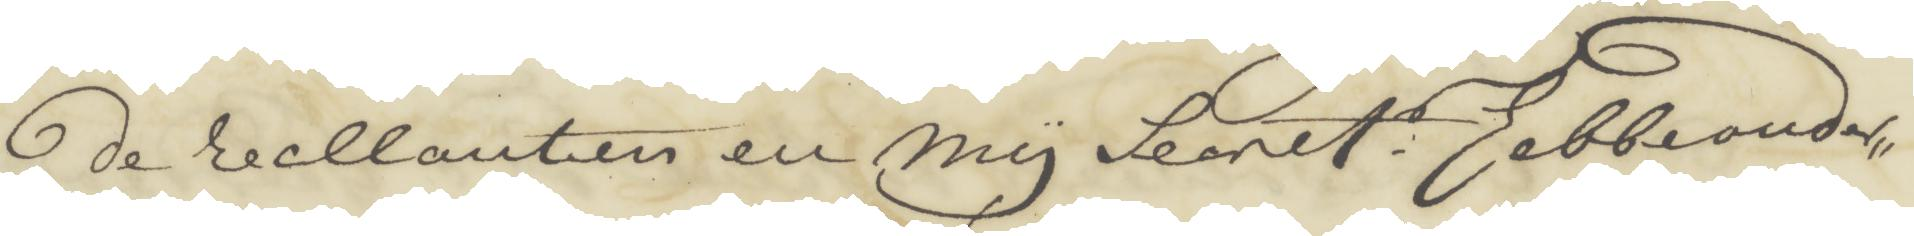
de recllanten en mij secret:s hebbe onder„
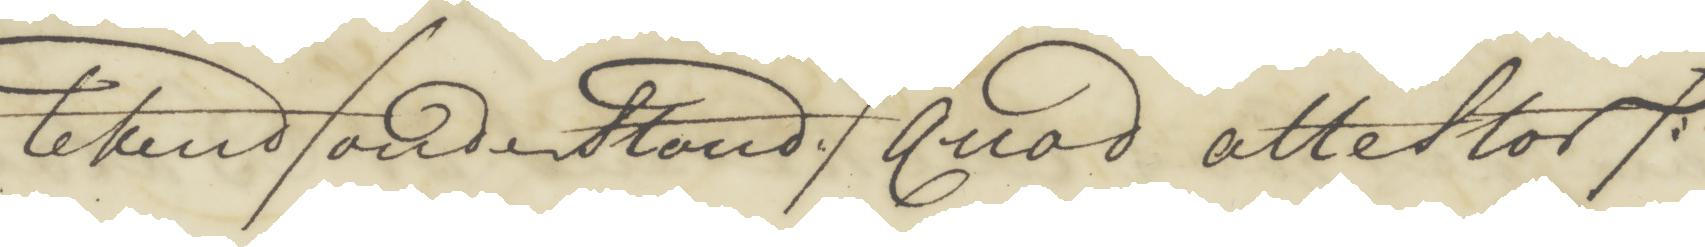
tekend /onderstond:/ quod attestos/:
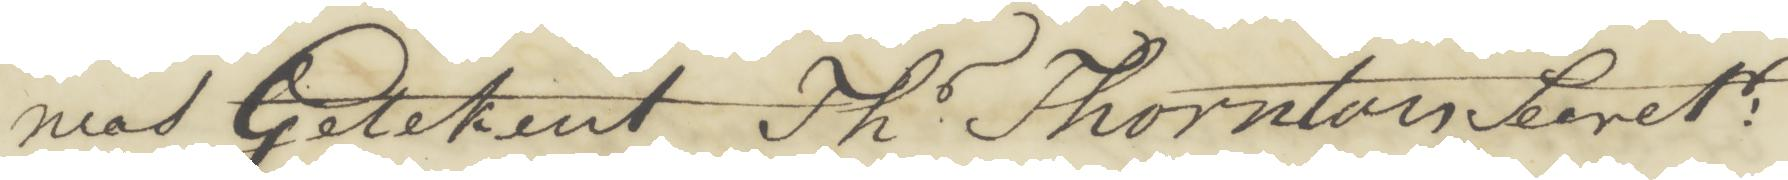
was Getekent Th.s Thornton Secret:s
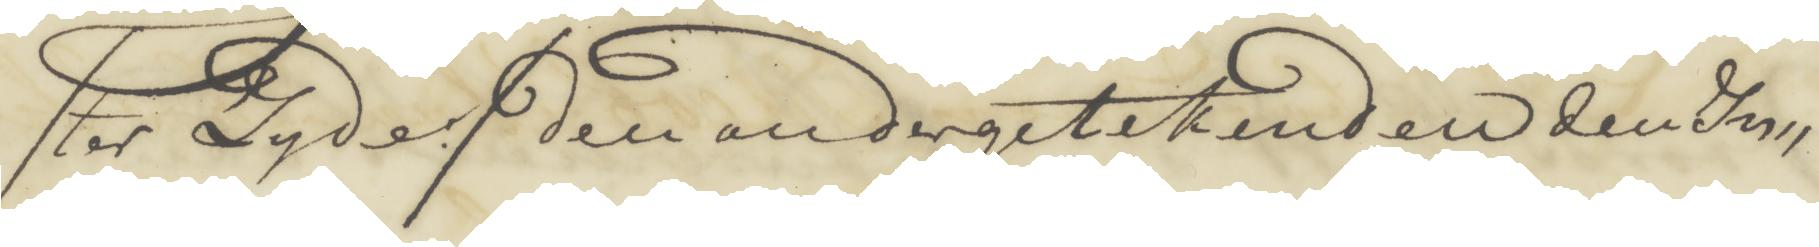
/ter zijde:/ den ondergetekenden den In„
